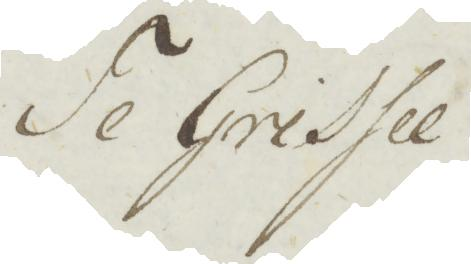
Te Grissee
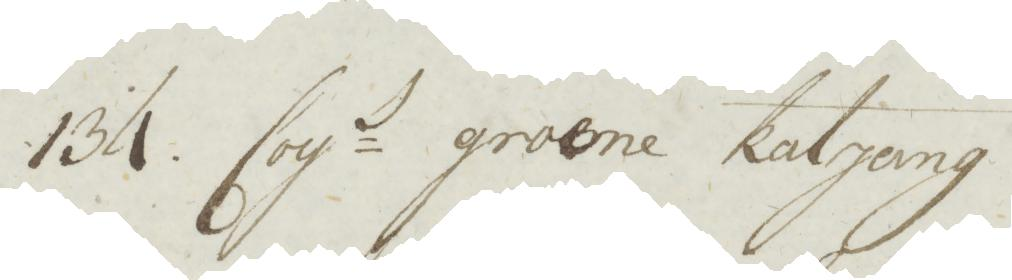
134. Coy=s groene katjang
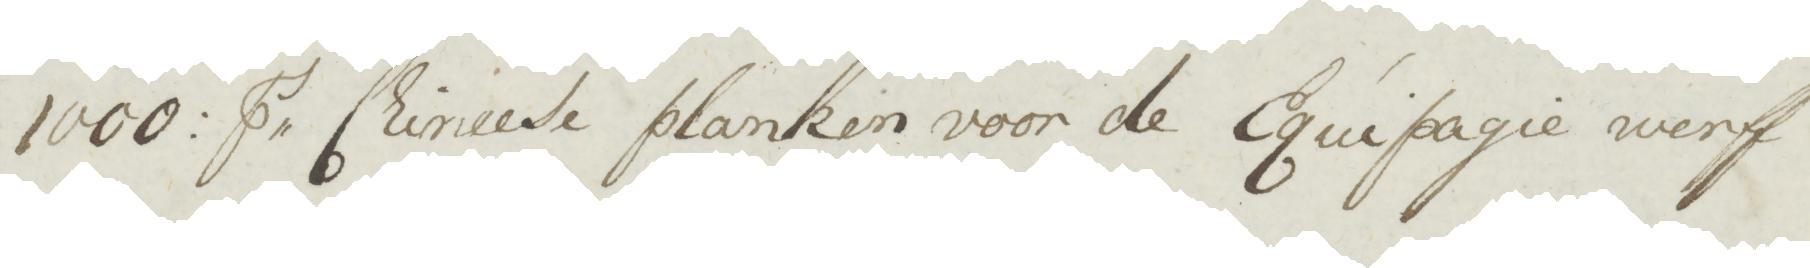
1000: p„s Chineese planken voor de Equipagie werff
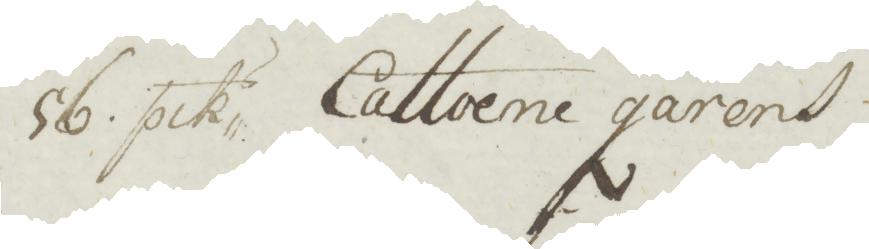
56. pik„s Cattoene garens
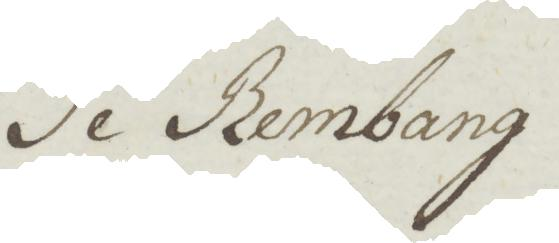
Te Rembang
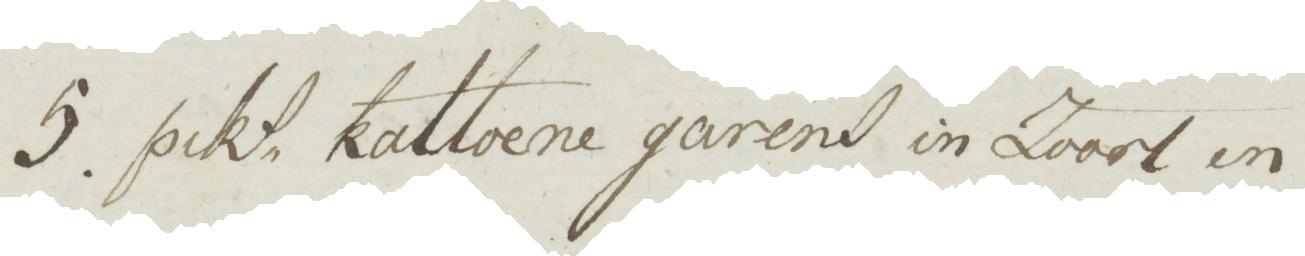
5. pik„s kattoene garens in zoort en
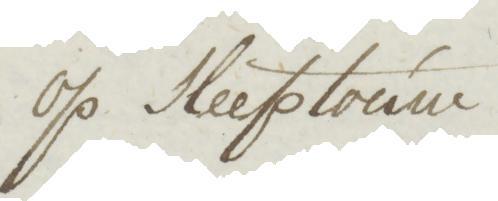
op sleeptouw
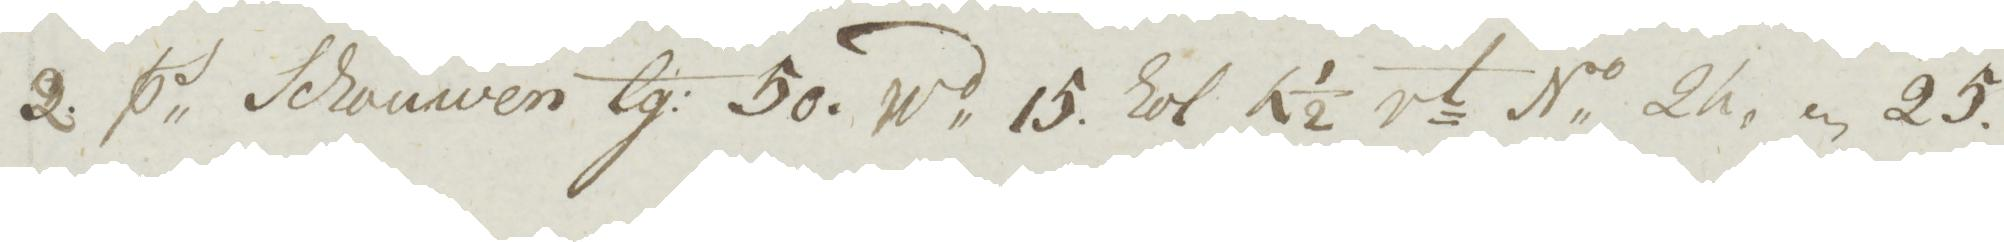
2. p„s schouwen lg: 50. w„d 15. hol 4½ v=t N„o 24„ en 25.
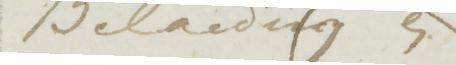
Belaeding en
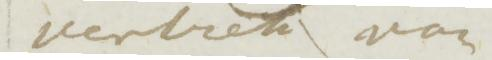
vertrek van
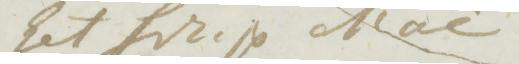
het schip Mac
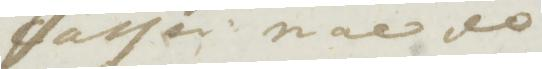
cassar nae de
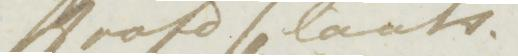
Hoofdplaats.
